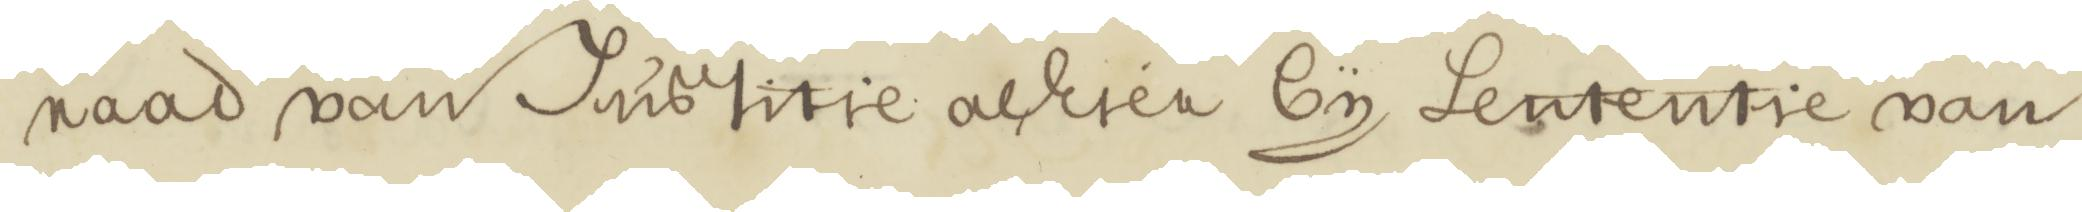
raad van Iustitie alhier bij sententie van
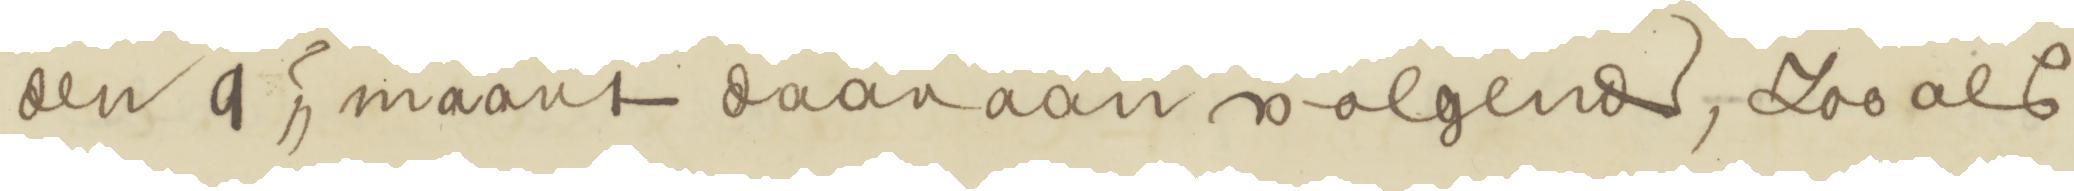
den 4„' maart daar aan volgende, zoo als
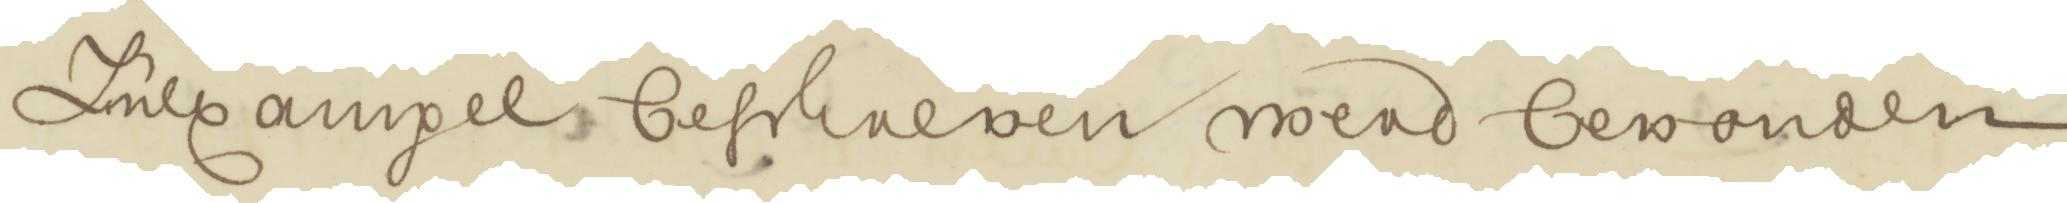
zulx ampel beschreven werd bevonden
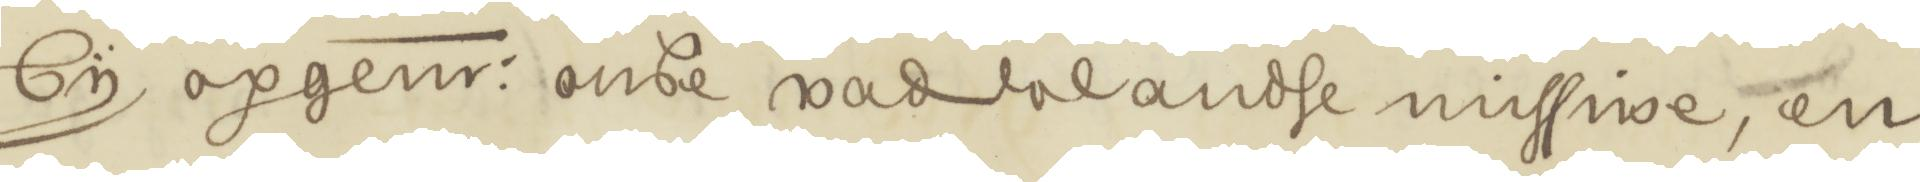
bij opgem: onse vaderlandse missive, en
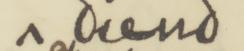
^diend
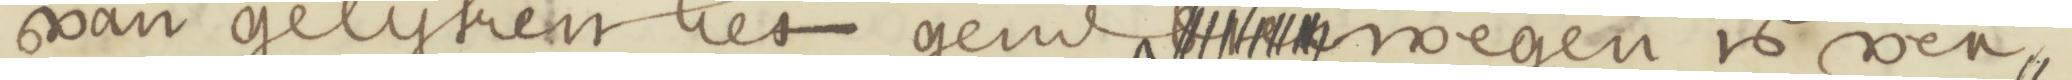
van gelijken het gene ^ wegen is ver„
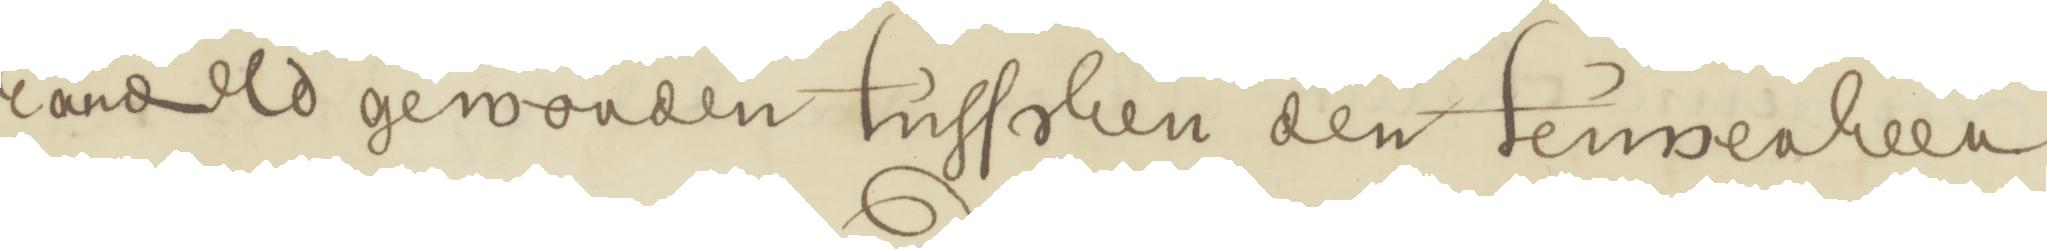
handeld geworden tusschen den teuverheer
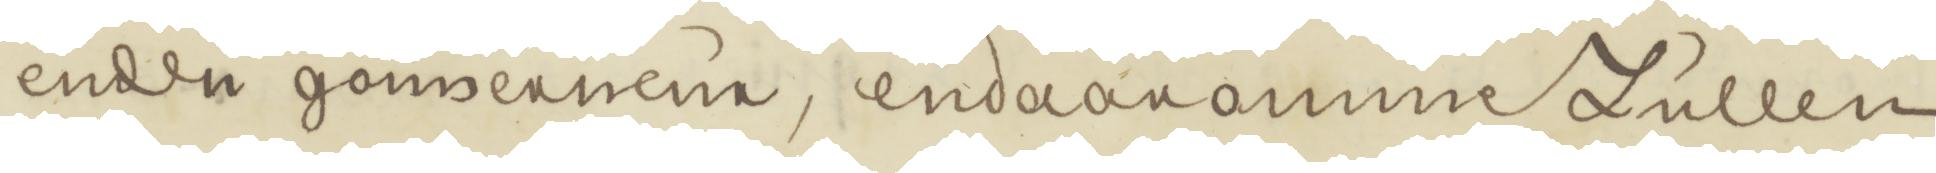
enden gouverneur, endaaromme zullen
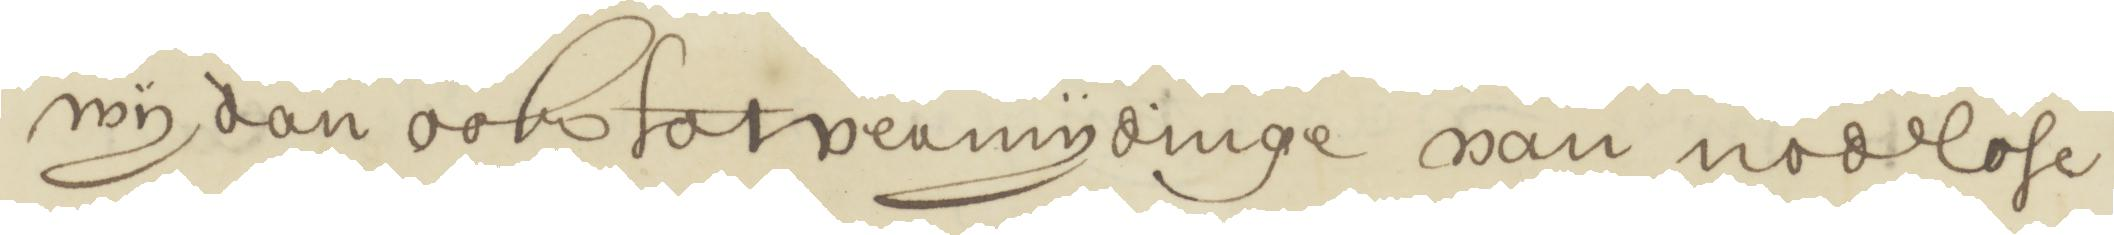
wij dan ook tot vermijdinge van nodelose
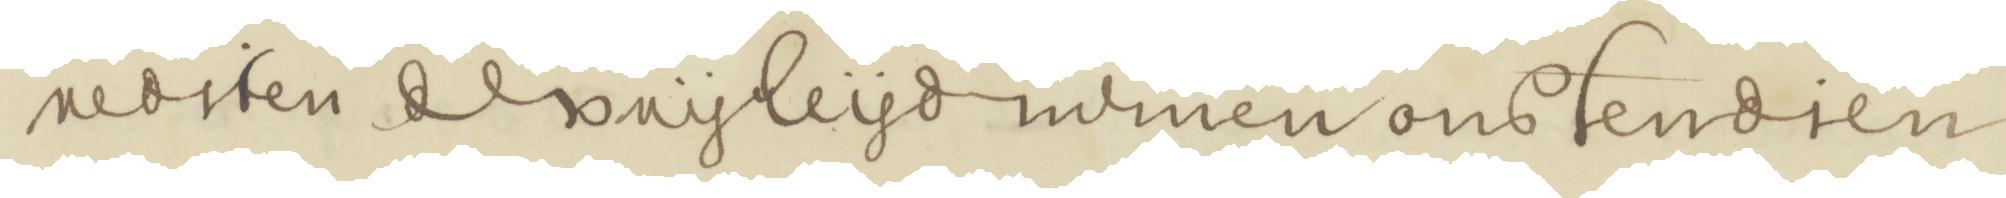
rediten de vrijheijd nemen ons tendien
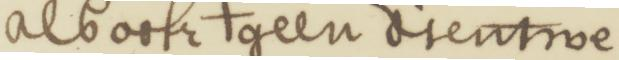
als ook 't geen dientwe
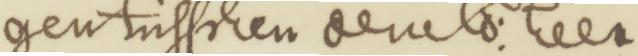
gen tusschen den Ed: heer
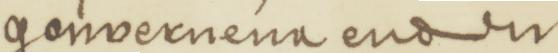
gouverneur enden
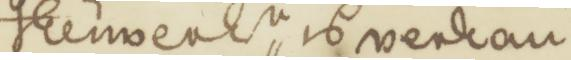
theuverh„r is verhan
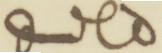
deld
